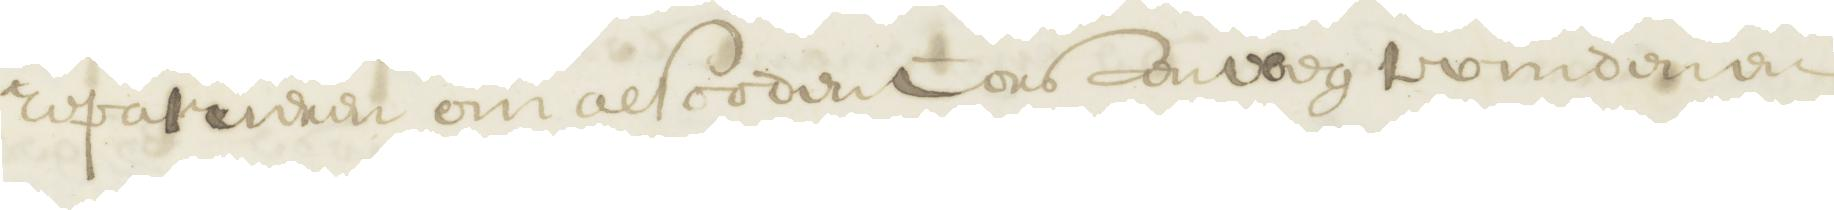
repatrieren om alsoo den Corsten weg te vinden en
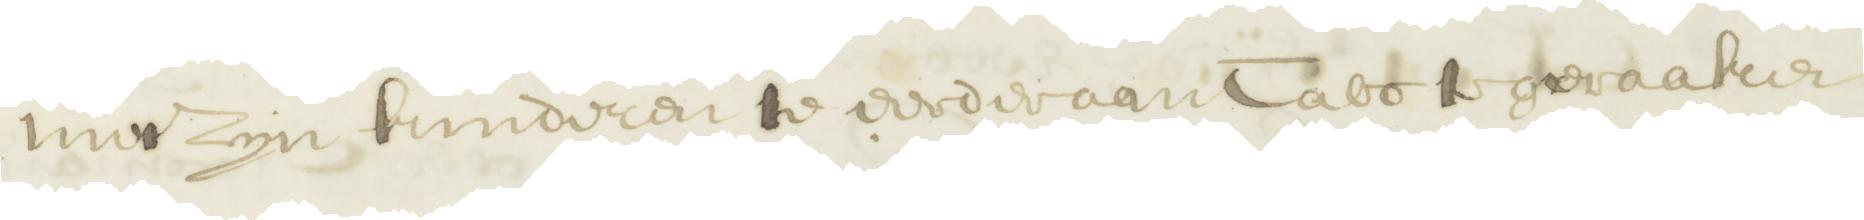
met zijn kinderen te eerder aan Cabo te geraaken
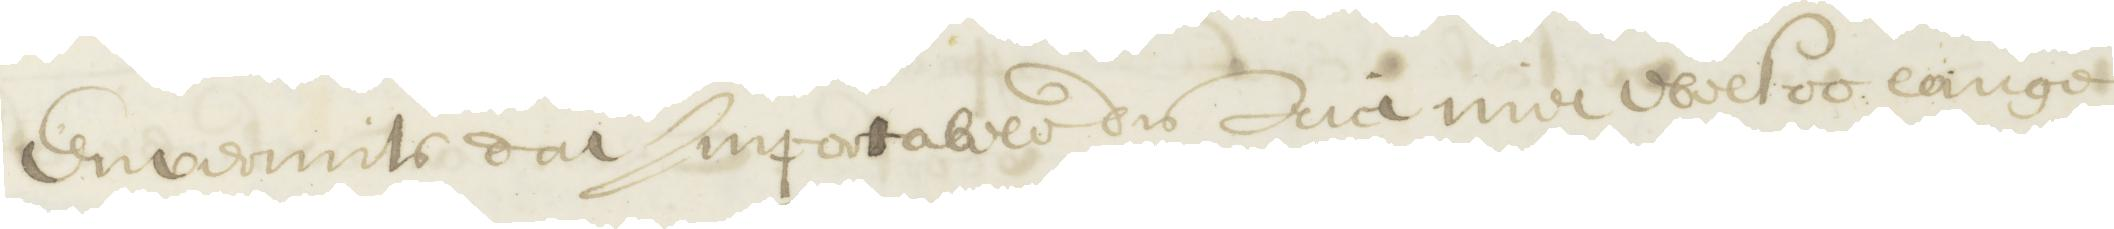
En vermits dat Jmportabele district niet wel soo lange
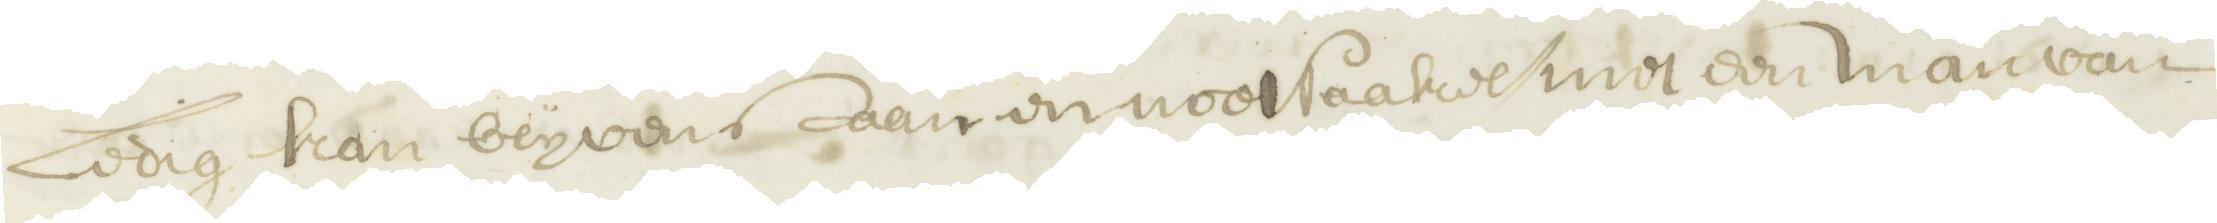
ledig kan blijven staan en nootsaakelijk met een man van
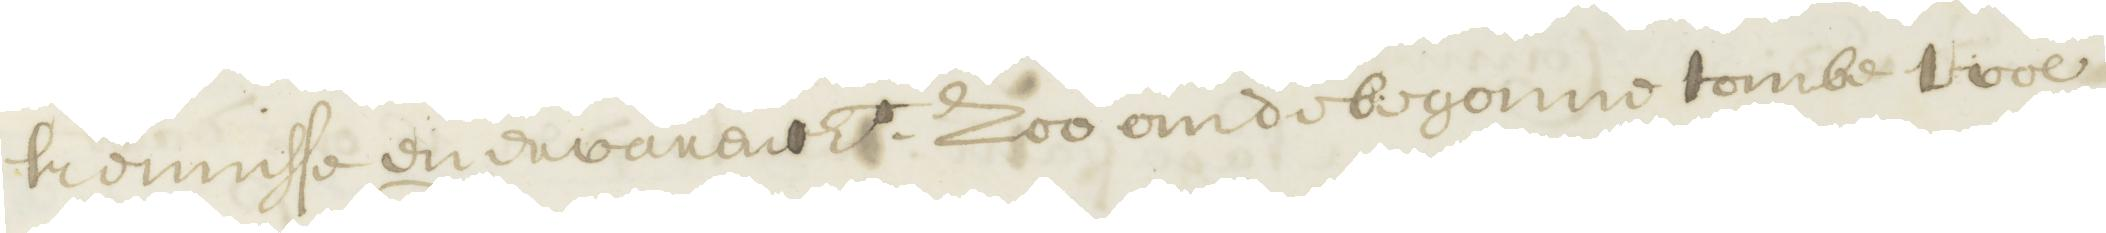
kennisse en ervarenth.t zoo om de begonne tombe te vol
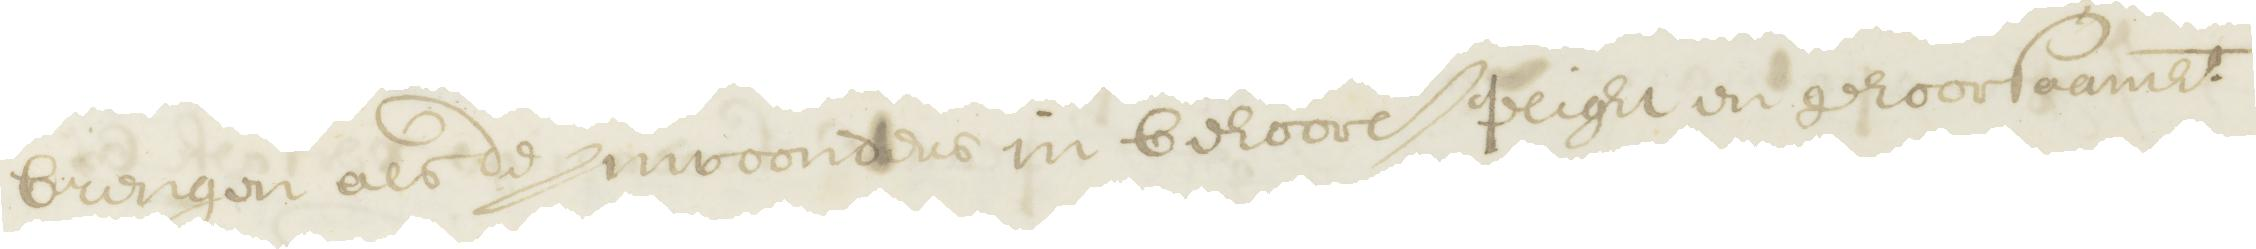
brengen als de Jnwoonders in behoorlijk plight en gehoorsaamh.t
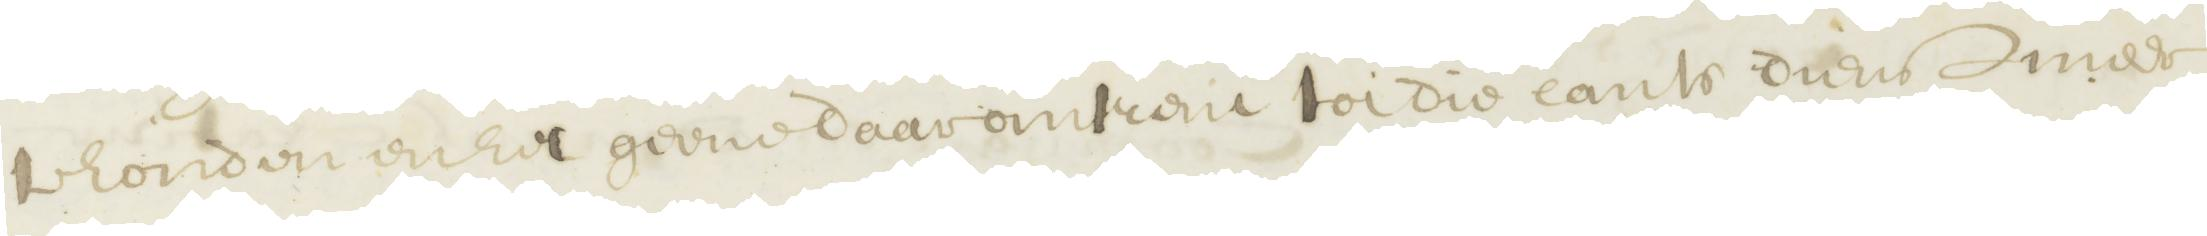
te houden en het geene daar omtrent tot die lants dienst meer
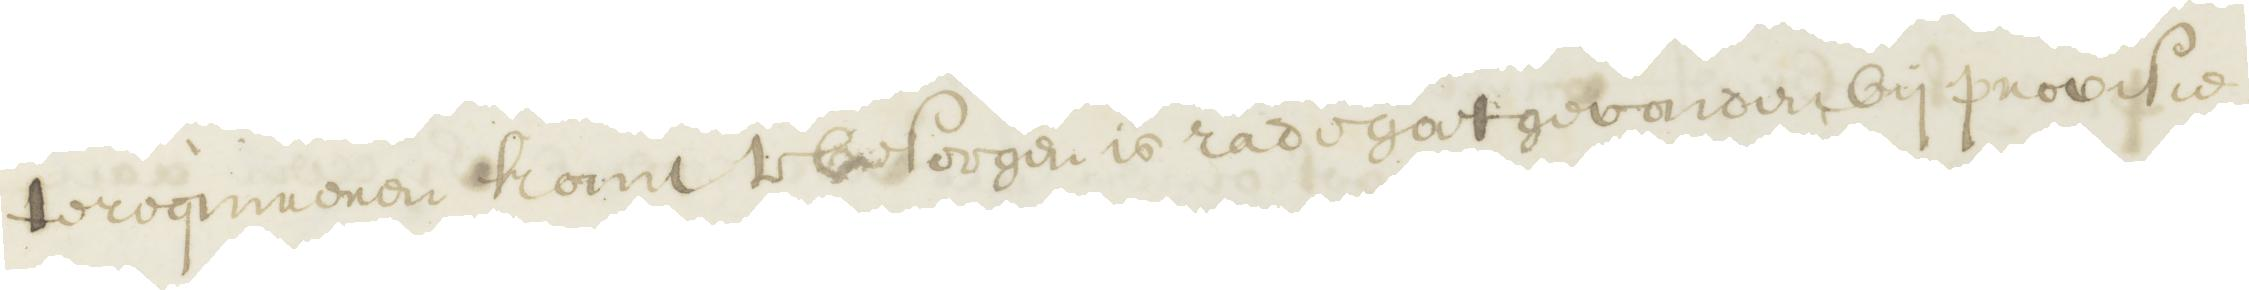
te reginreren komt te besorgen is rade goet gevonden bij provisie
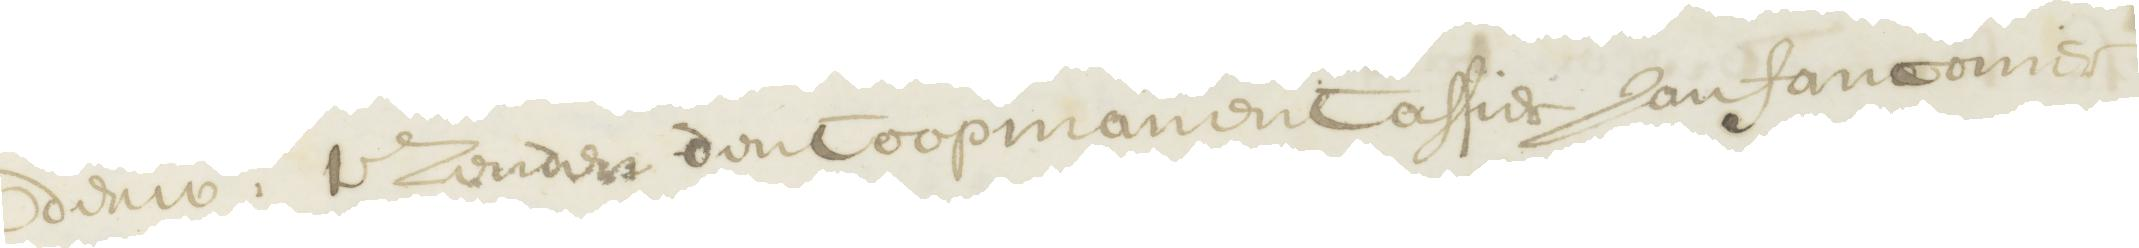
derw:ts te zenden den Coopman en Cassier Jan fauconier
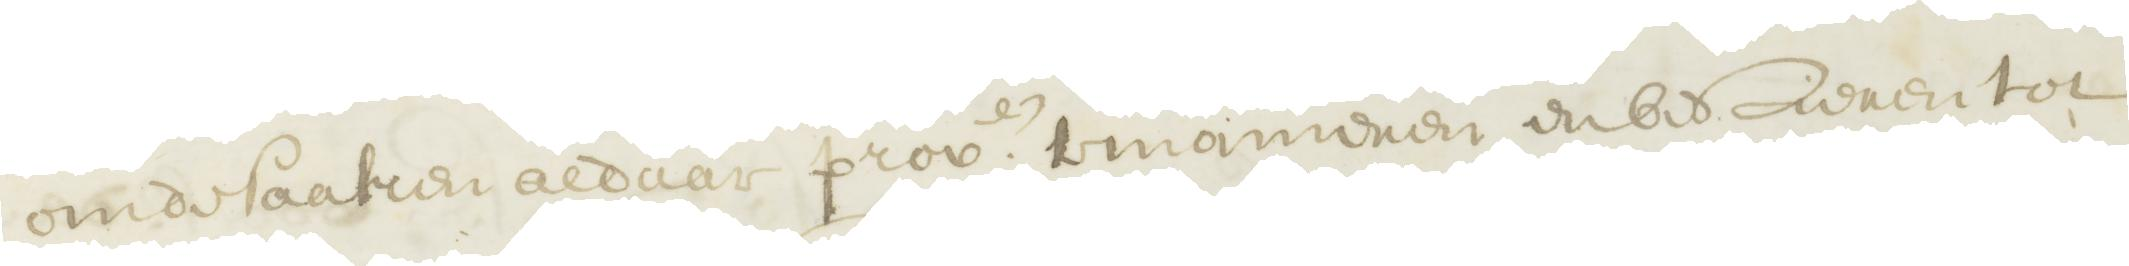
om de saaken aldaar prov.'' te manieren en bestieren tot
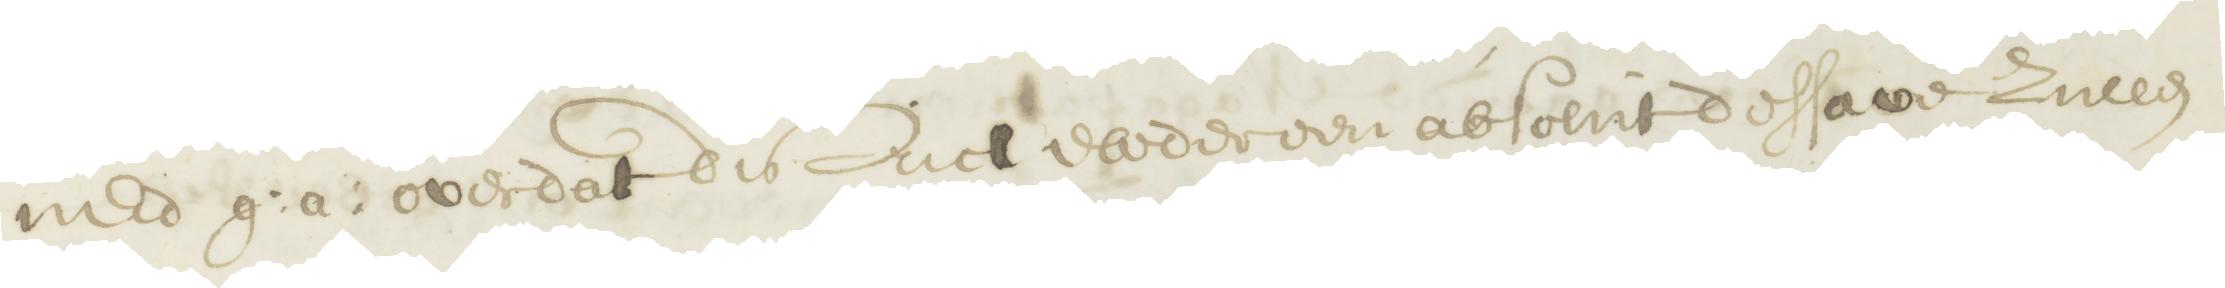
uEd g: a: over dat district weder een absolut dessave zullen
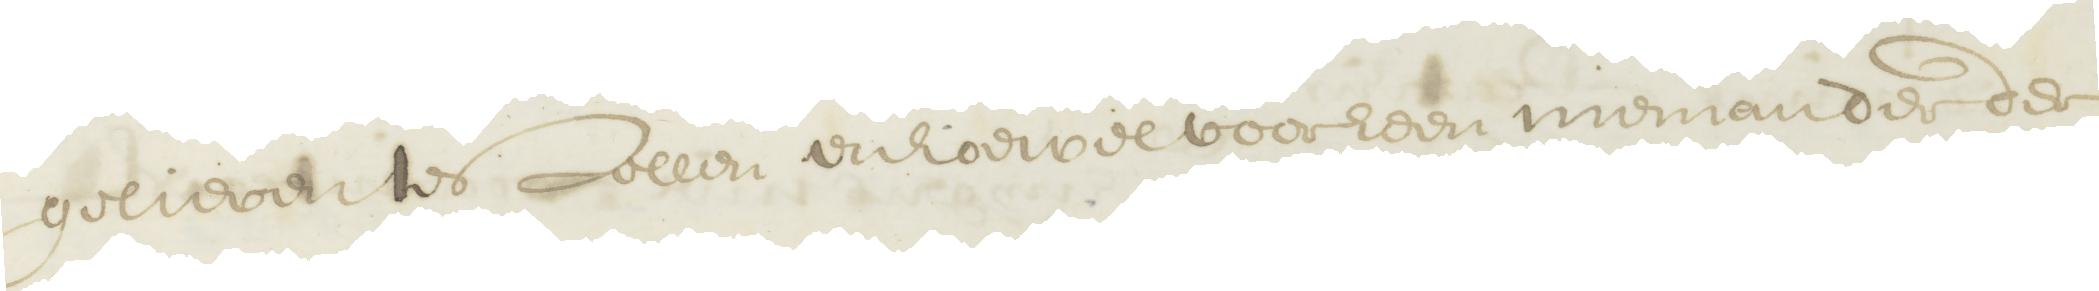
gelieven te stellen en hoewel voor heen niemander der
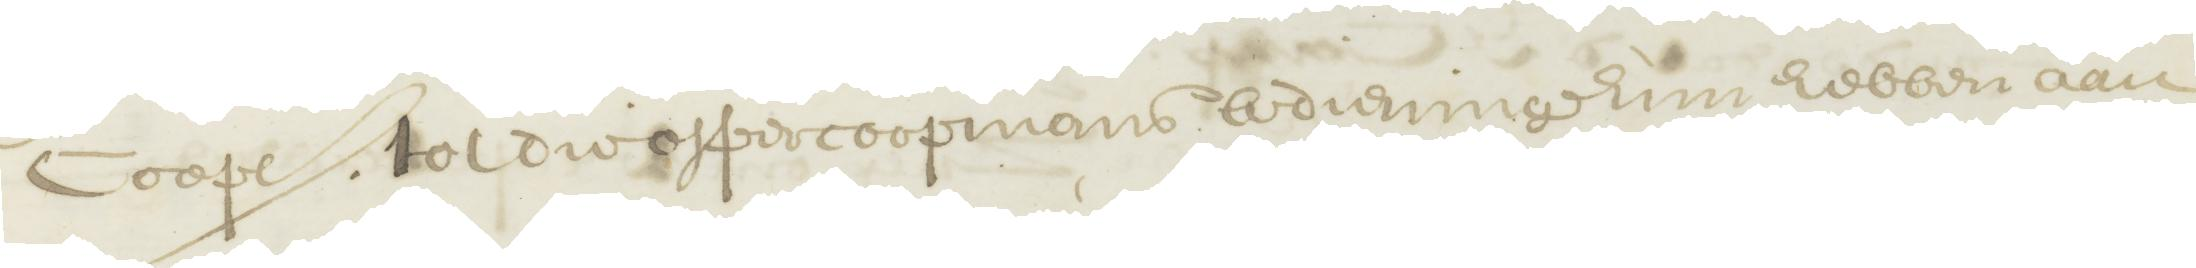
Coopl. tot die oppercoopmans bedieninge hun hebben aan
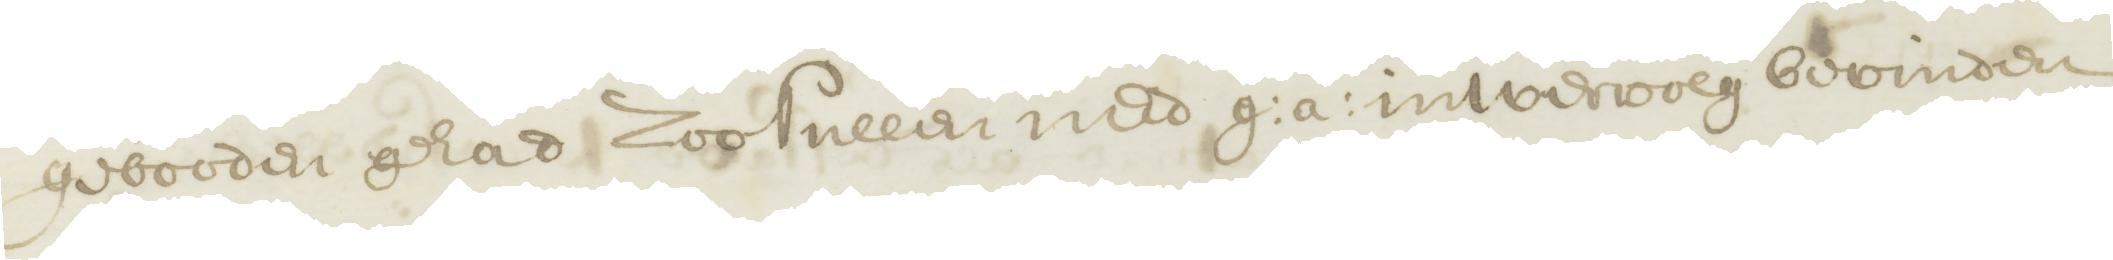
gebooden gehad zoo sullen uEd g: a: int vervolg bevinden
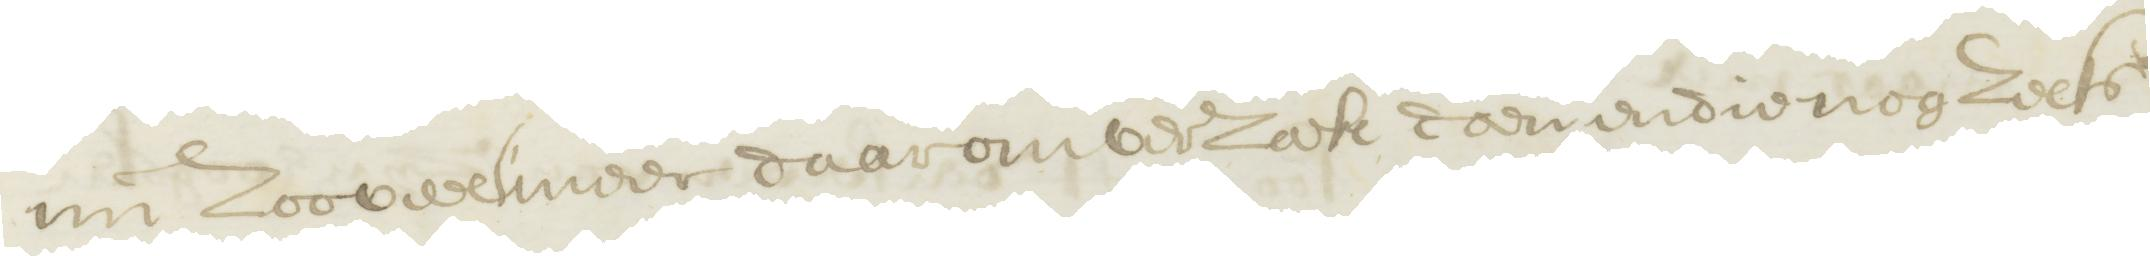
nu zooveelt'meer daar om verzoek doen en die nog zelfs
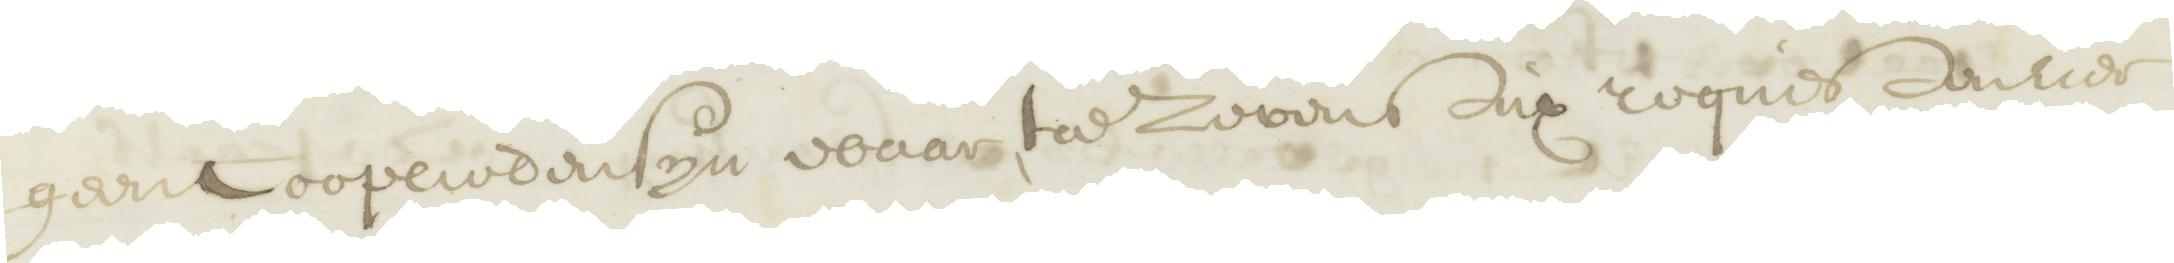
geen cooplieden sijn waar toe zevenstux requesten hier
